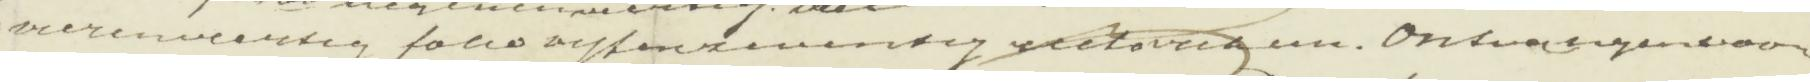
vierenveertig folio vyfenzeventig recto vak een. Ontvangen voor
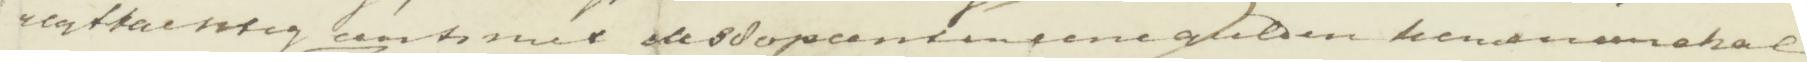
regt tachtig Cents met de 38 opcenten eene gulden tien en een hal
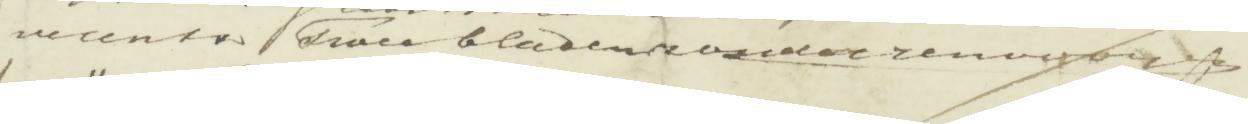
ve cents twee bladen zonder renvooi
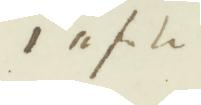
1 afk
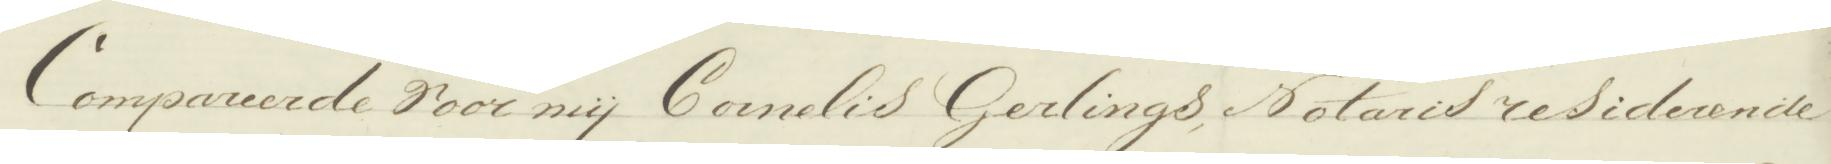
Compareerde Voor mij Cornelis Gerlings, Notaris residerende
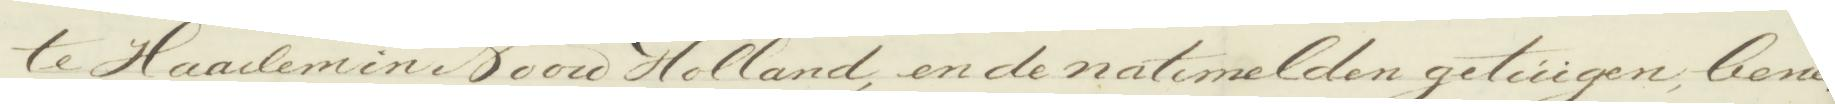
te Haarlem in Noord Holland, en de natemelden getuigen, bene
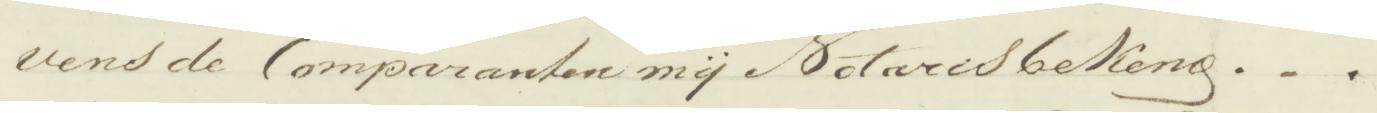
vens de Comparanten mij Notaris bekend . . .
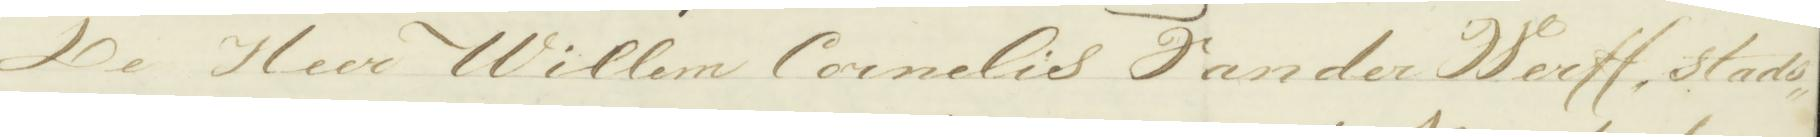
De Heer Willem Cornelis Van der Werff, stads„
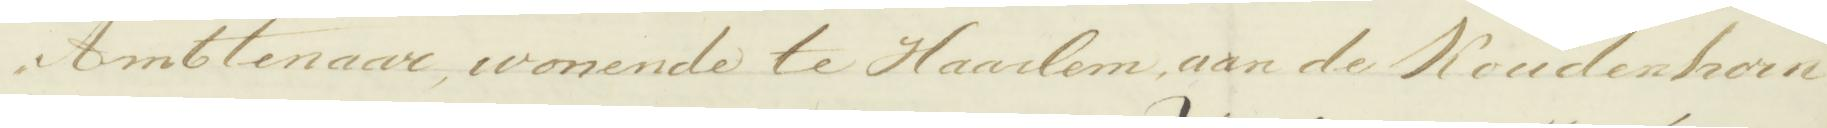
„Ambtenaar, wonende te Haarlem, aan de Koudenhorn
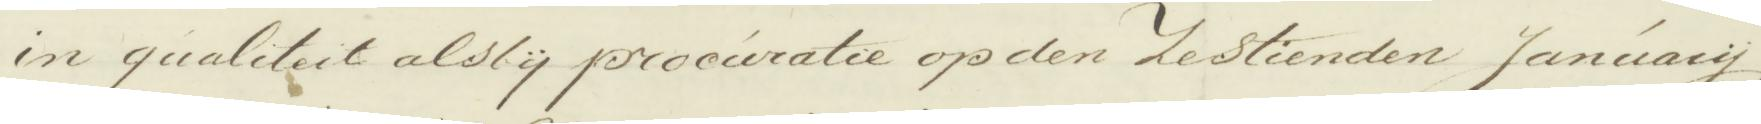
in qualiteit als bij procuratie op den Zestienden Januarij
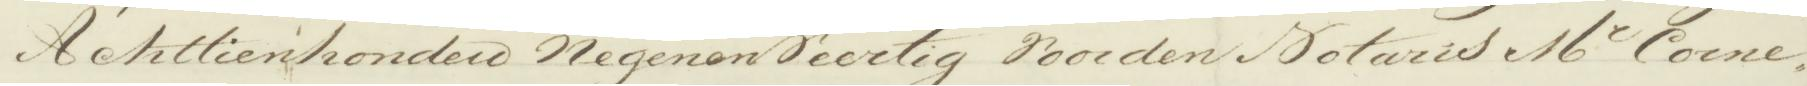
Achttienhonderd Negenen Veertig Voor den Notaris Mr Corne„
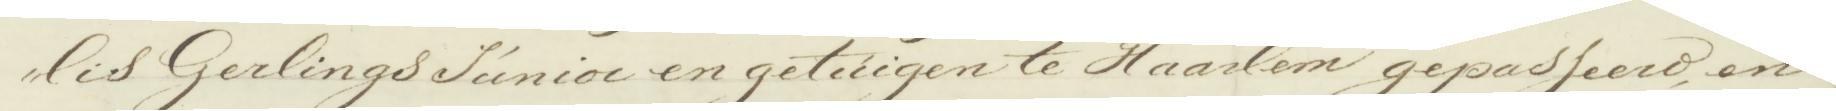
„lis Gerlings Iunior en getuigen te Haarlem gepasseerd, en
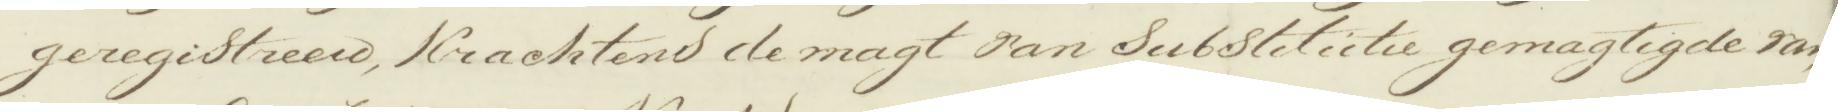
geregistreerd, Krachtens de magt van substitutie gemagtigde van
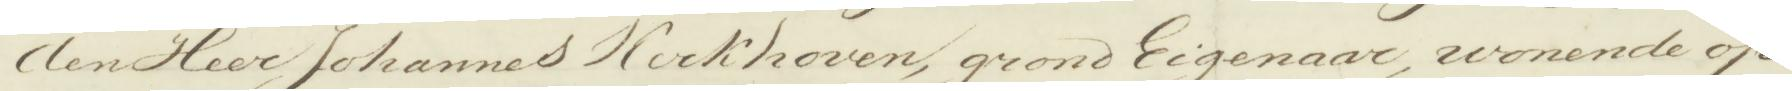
den Heer Johannes Kerkhoven, grond Eigenaar, wonende op
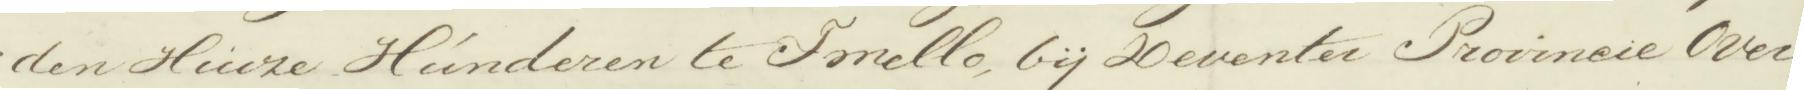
den Huize Hunderen te Twello, bij Deventer Provincie Over
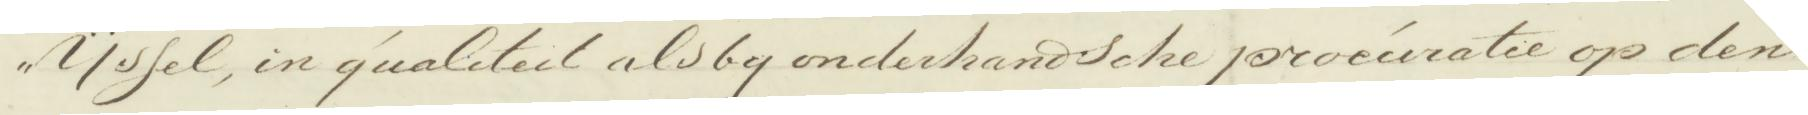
„ijssel, in qualiteit als bij onderhandsche procuratie op den
